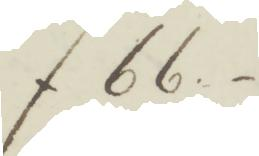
ƒ 66.-
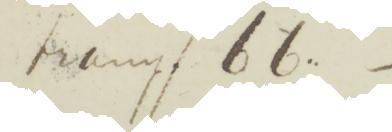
transp ƒ 66: _
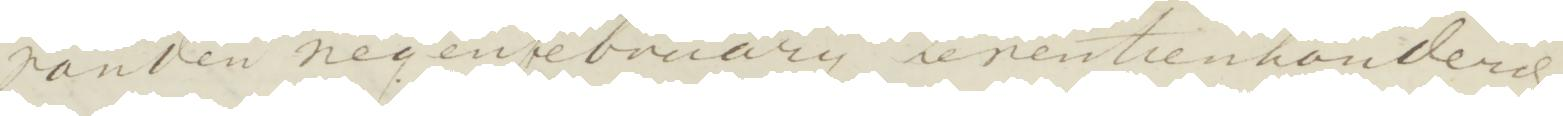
van den negen februarij zeventienhonderd
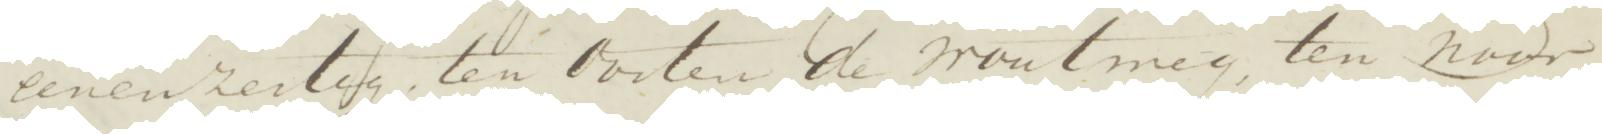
eenenzestig, ten Oosten de woutweg, ten Noor-
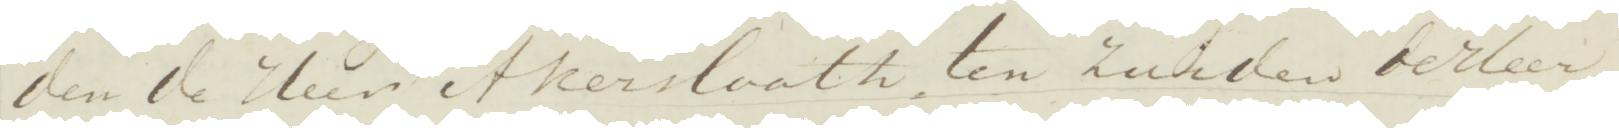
den de Heer Akerslooth, ten zuiden de Heer
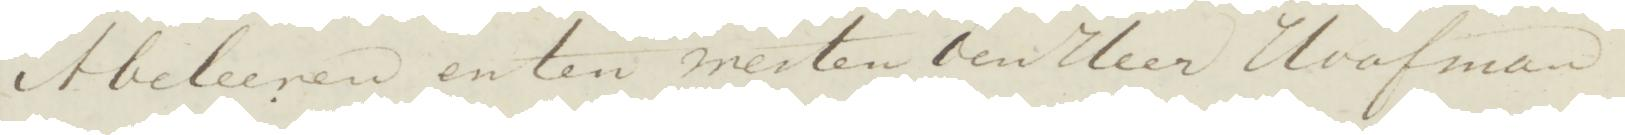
Abeleeren en ten westen den Heer Hoofman
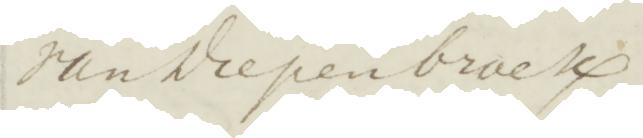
van Diepenbroek
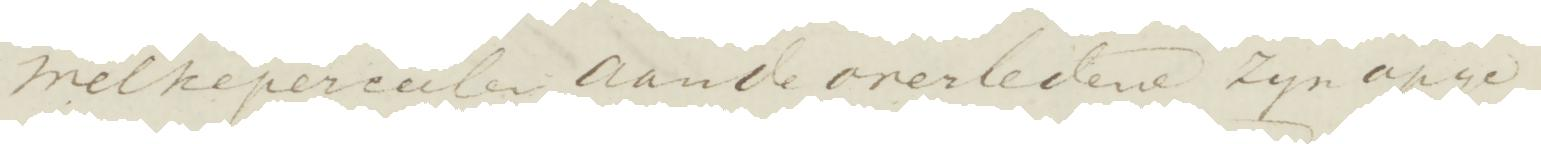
welke perceelen Aan de overledene zyn opge
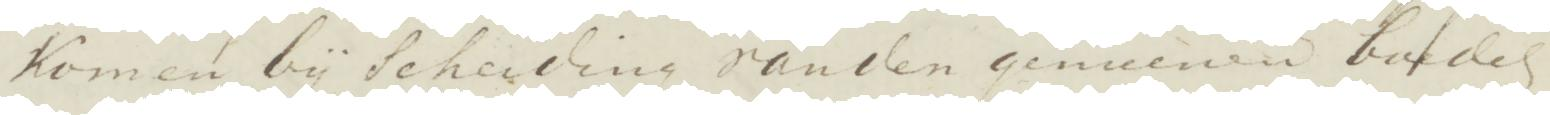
komen bij scheiding van den gemeenen boedel
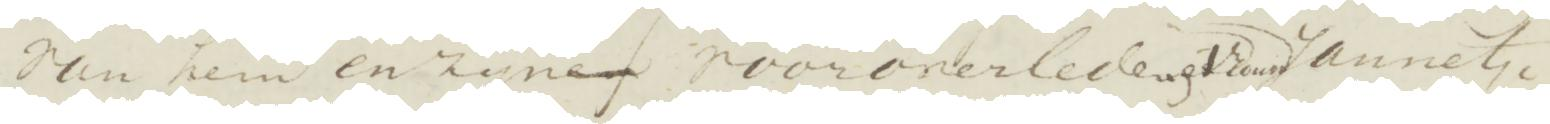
van hem en zijne voor overleden Vrouw annetje
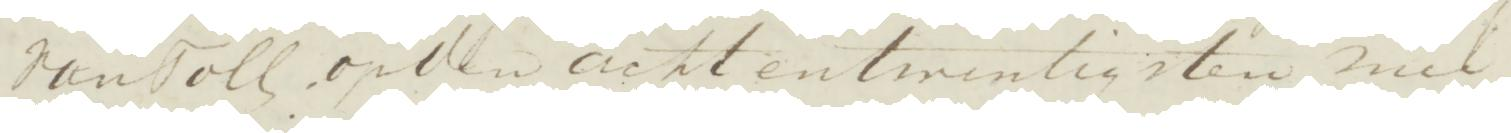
van Toll, op den acht en twintigsten mei
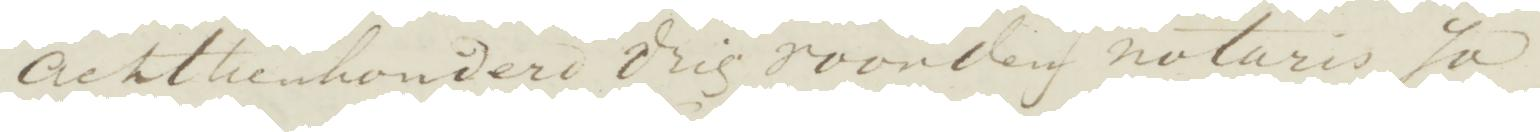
Achttienhonderd drie voor den notaris Jo
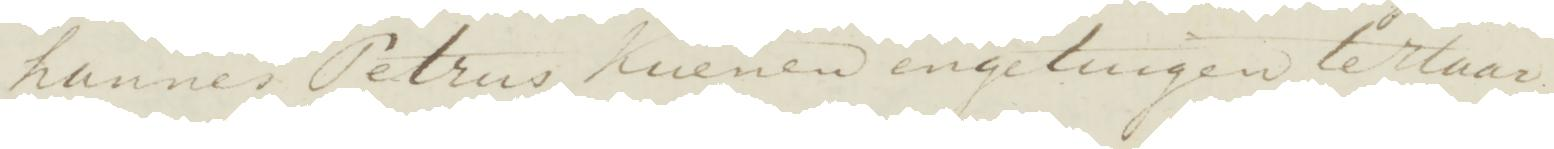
hannes Petrus Kuenen en getuigen te Haar
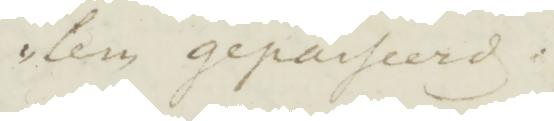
„lem gepasseerd:
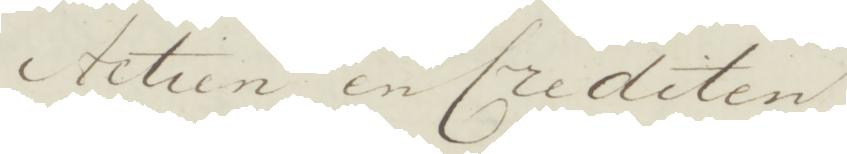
Actien en Crediten
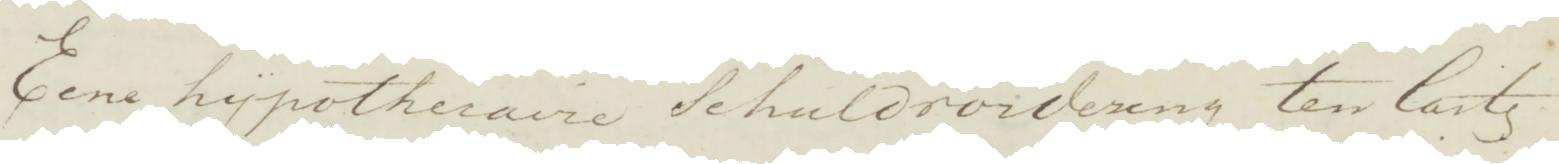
Eene hijpothecaire schuldvordering ten lasten
